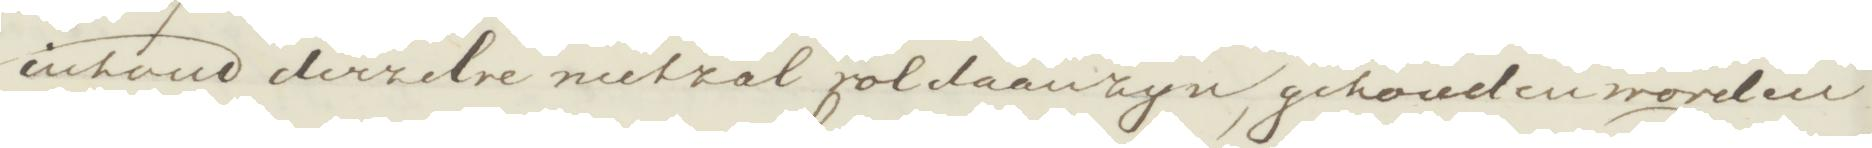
inhoud derzelve niet zal voldaan zyn, gehouden worden
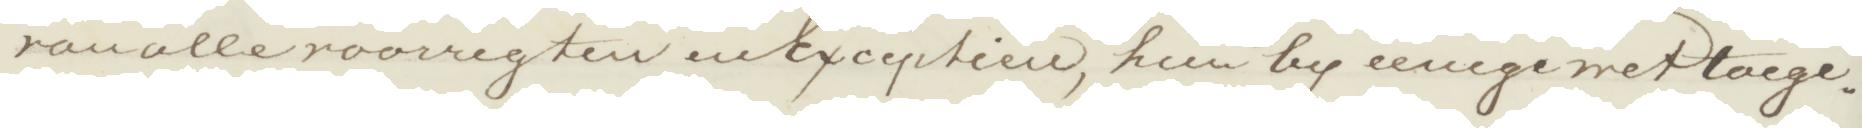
van alle voorregten en Exceptien, hun by eenige wet toege„
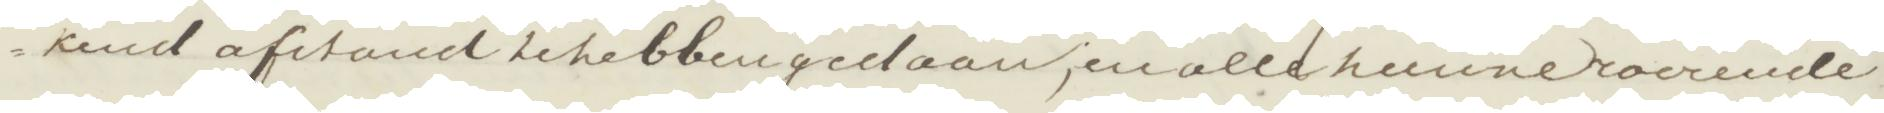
=kend afstand te hebben gedaan, en alle hunne roerende
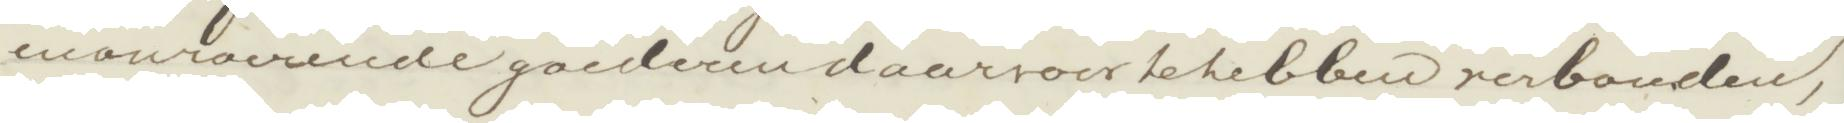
en onroerende goederen daarvoor te hebben verbonden,
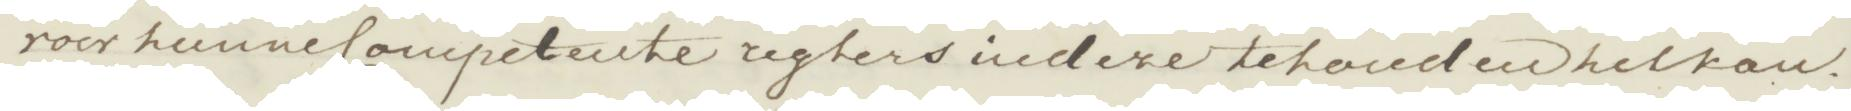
voor hunne Competente regters in deze tehouden het kan.
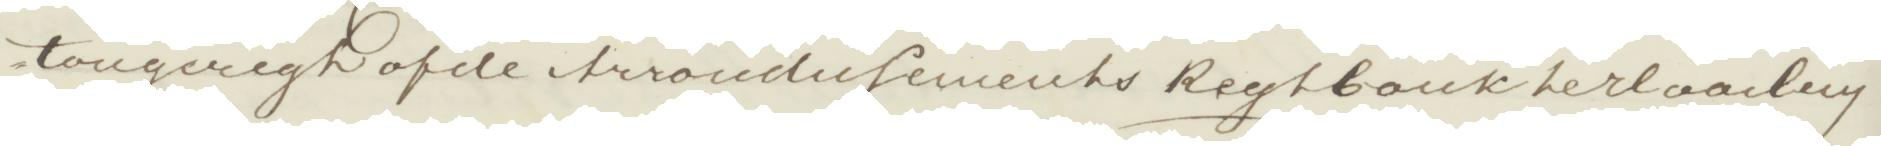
„tongeregt of de Arrondissements Regtbank te Haarlem
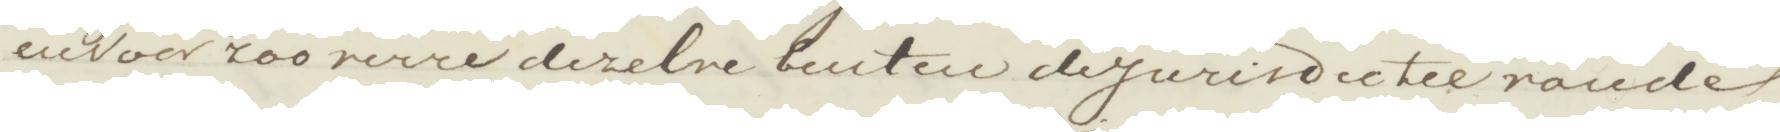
en voor zoo verre dezelve buiten de jurisdictie van de
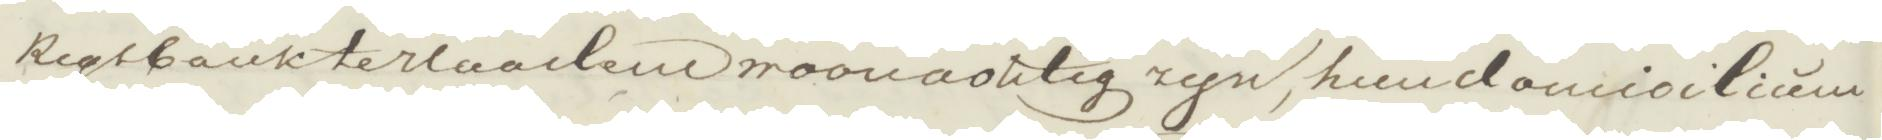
Regtbank te Haarlem woonachtig zyn, hun domicilium
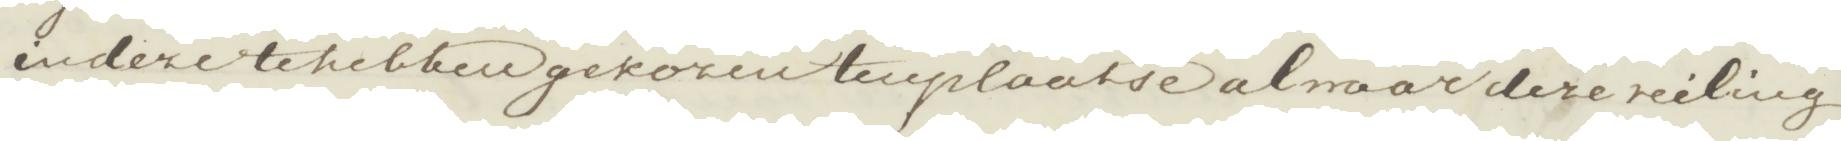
in deze te hebben gekozen ten plaatse alwaar deze veiling
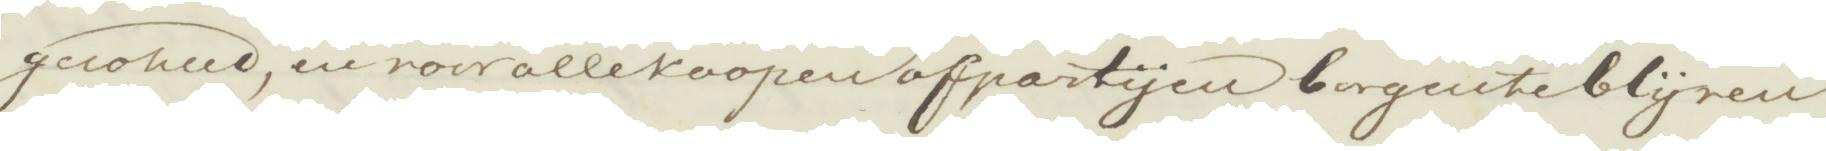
geschied, en voor alle koopen of partijen borgen te blijven
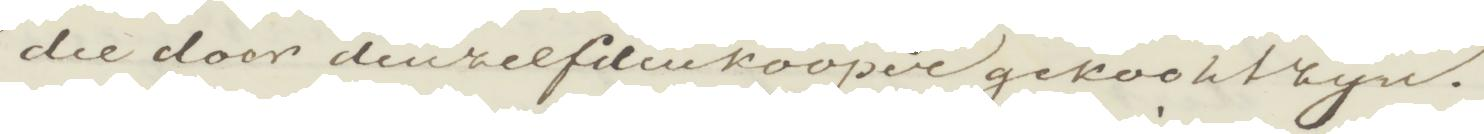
die door denzelfden kooper gekocht zyn.
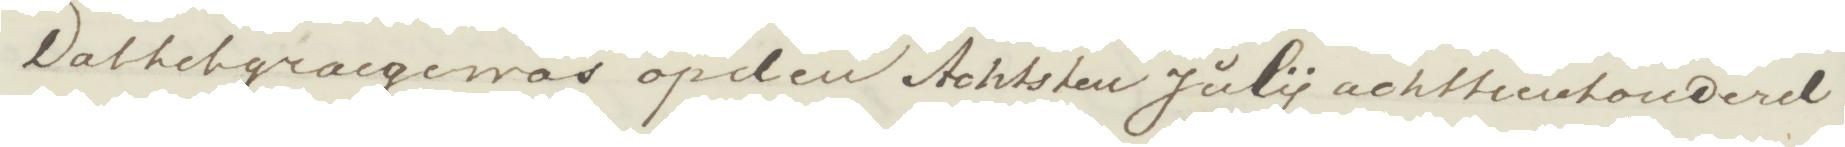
Dat het grasgewas op den Achtsten Julij achttienhonderd
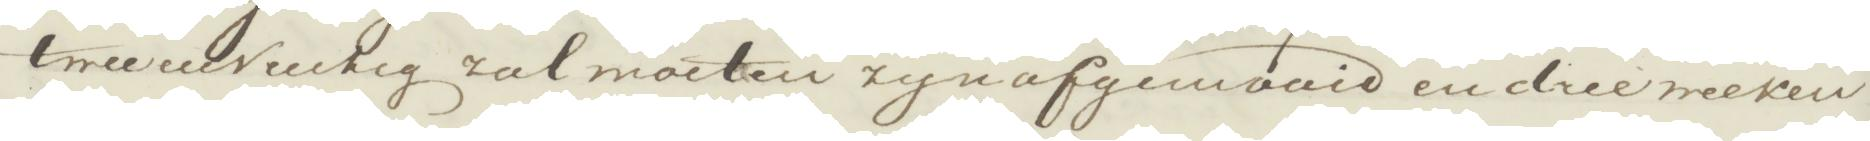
twee enveertig zal moeten zyn afgemaaid en drie weeken
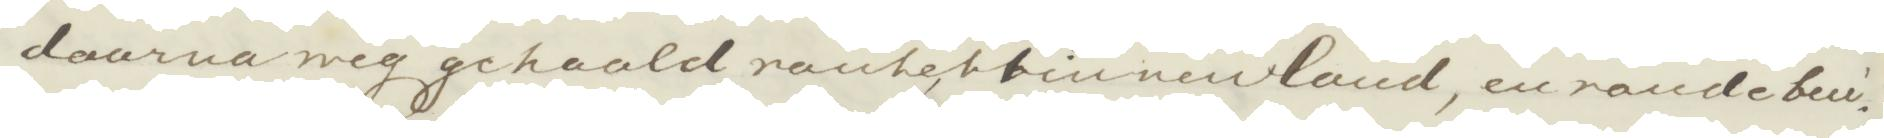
daarna weg gehaald van het binnen land, en vande bui.
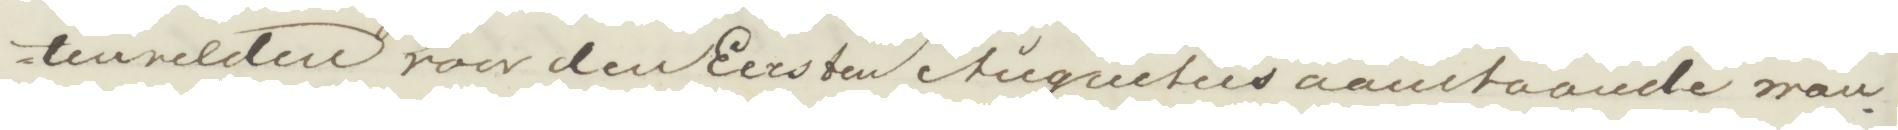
=tenvelden voor den Eersten Augustus aanstaande wan.
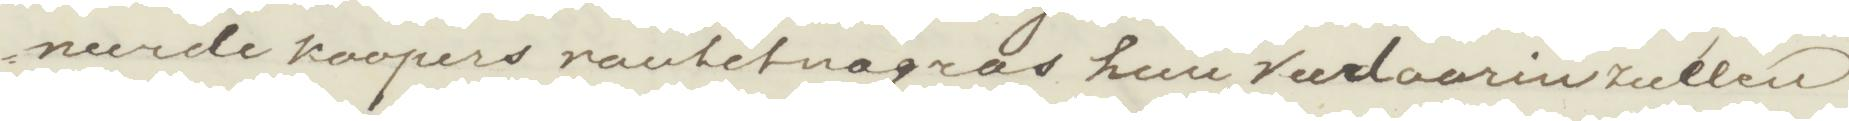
=neer de koopers van het nagras hun vee daarin zullen
